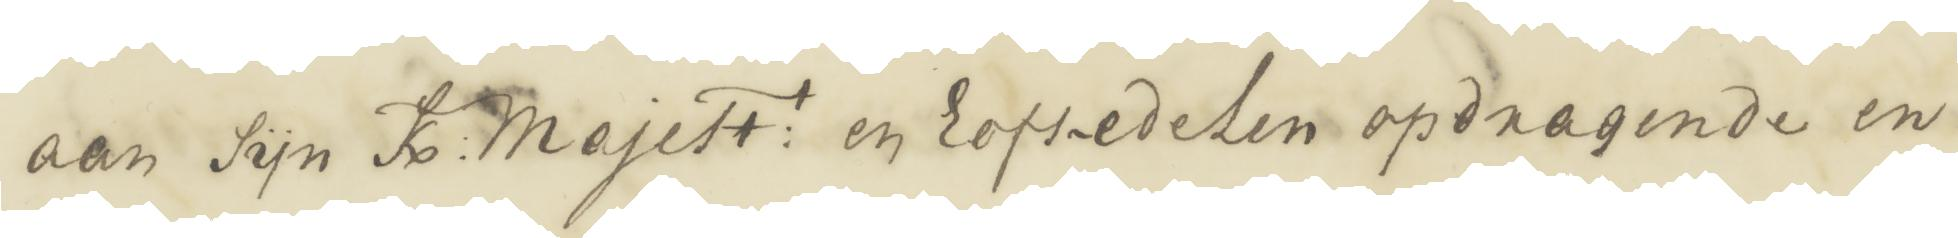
aan sijn k: Majest:t en hofsedelen opdragende en
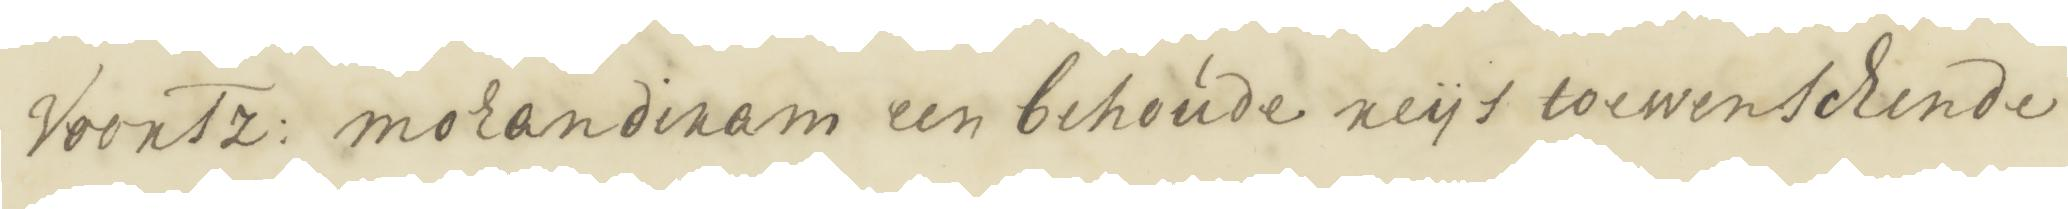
voorsz: mohandiram een behoude reijs toewenschende
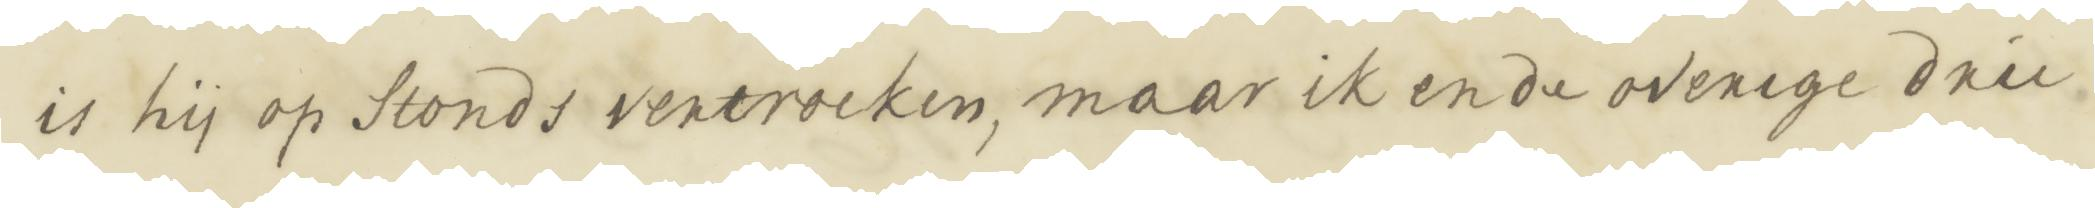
is hij op stonds vertrocken, maar ik en de overige drie
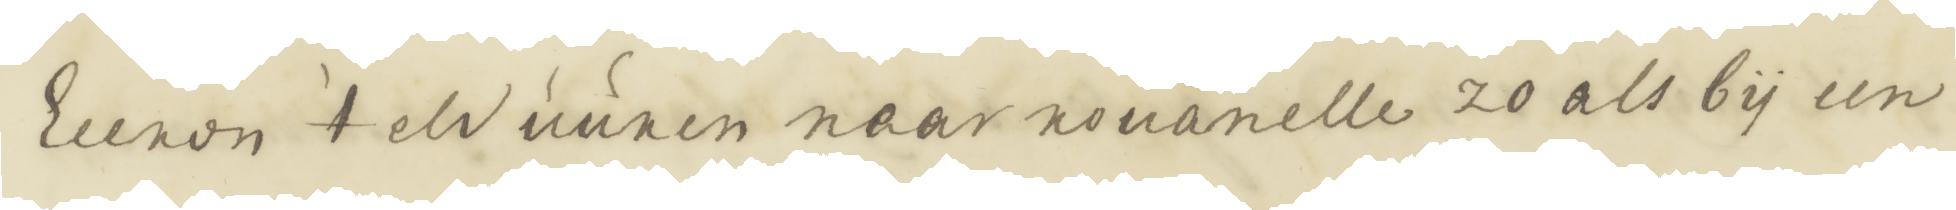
heeren ’t elv uuren naar rouanelle zo als bij een
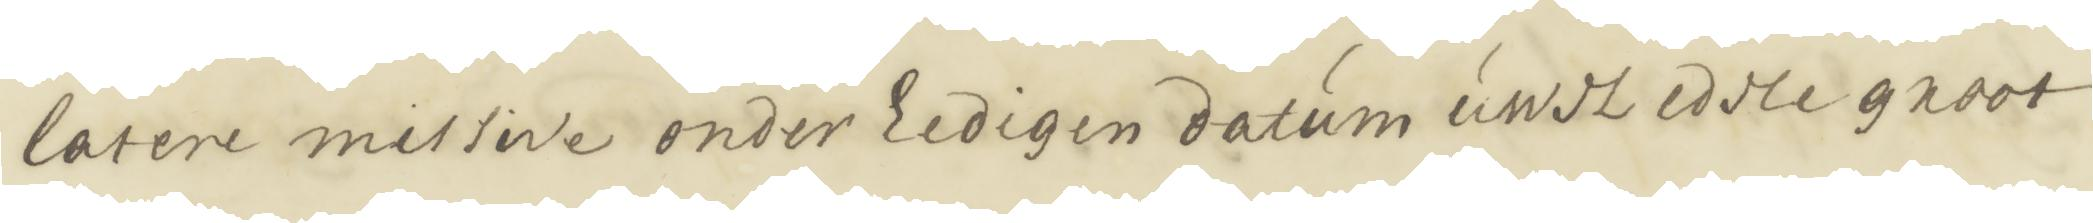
latere missive onder hedigen datum uwel edele groot
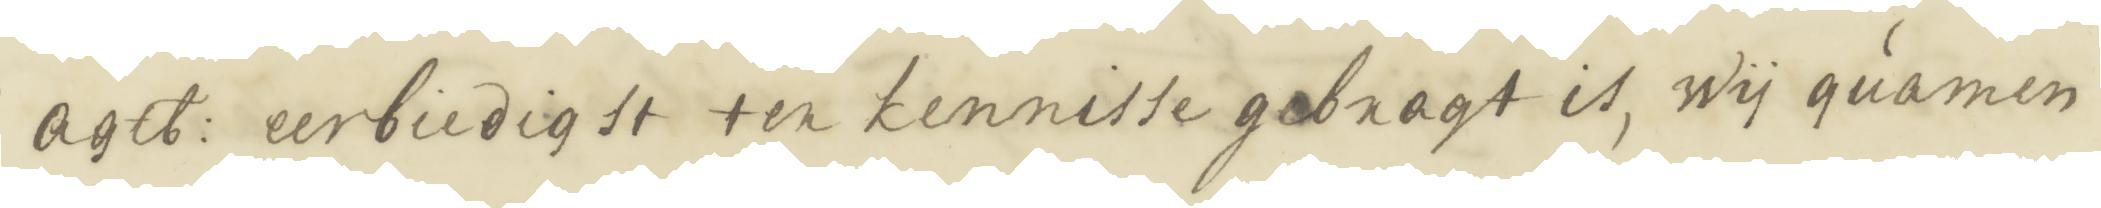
agtb: eerbiedigst ter kennisse gebragt is, wij quamen
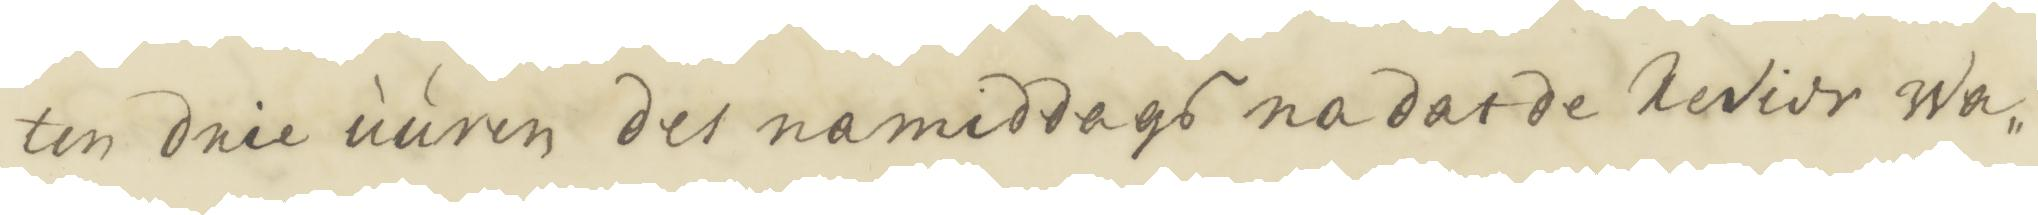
ten drie uuren des namiddags na dat de revier wa„
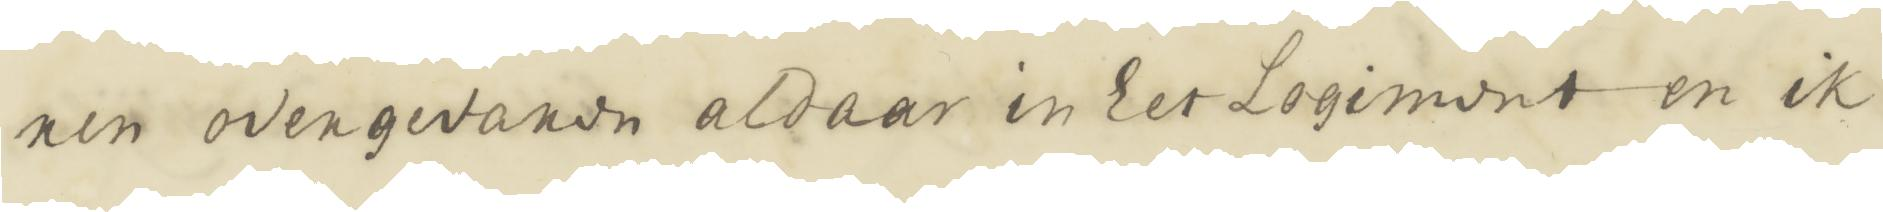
ren overgevaren aldaar in het Logiment en ik
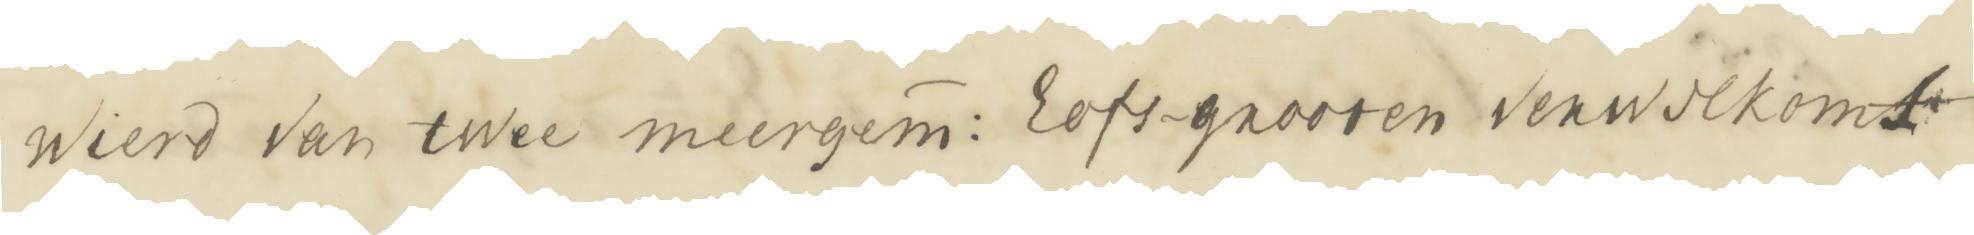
wierd van twee meergem: hofsgrooten verwelkomt
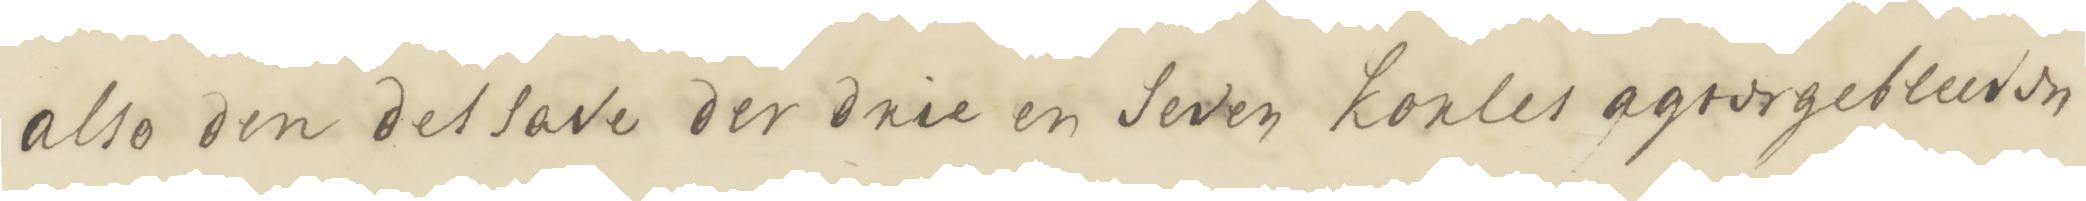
also den dessave der drie en seven korles agtergebleeven
